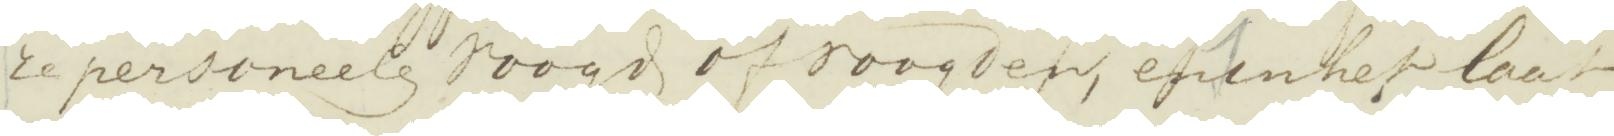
re personeele Voogd of Voogden, en in het laat
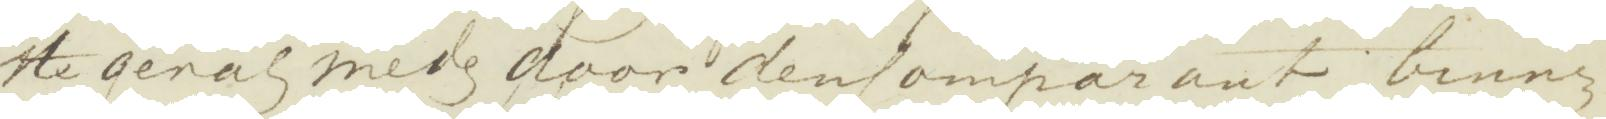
ste geval mede door den Comparant binnen
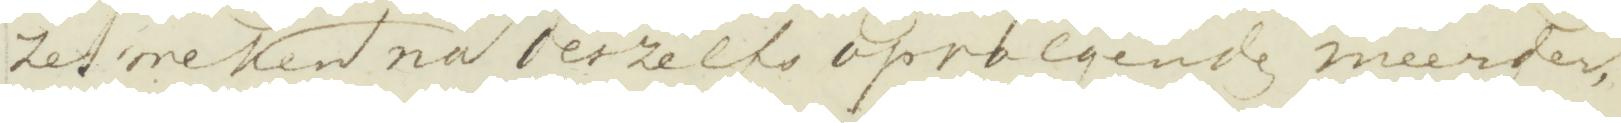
zes weken na derzelfs opvolgende meerder,
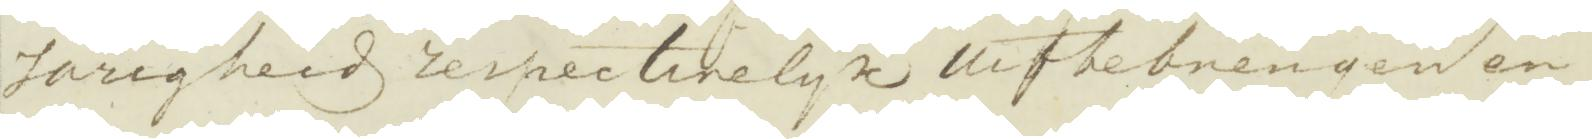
Jarigheid respectivelyk uittebrengen en
